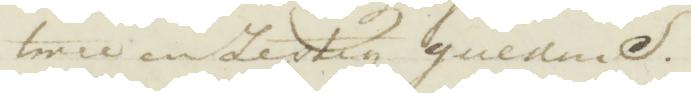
twee en Zestig guldens.
